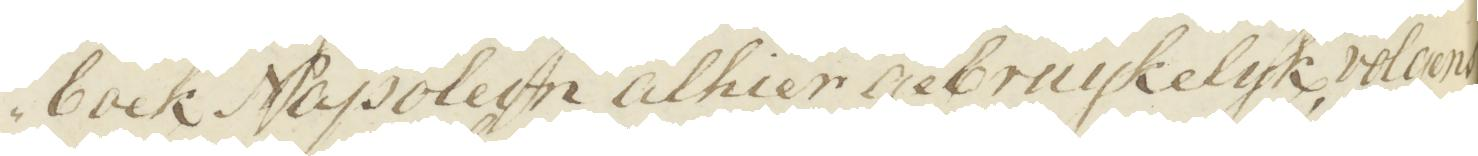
„boek Napoleon alhier gebruykelyk, volgens
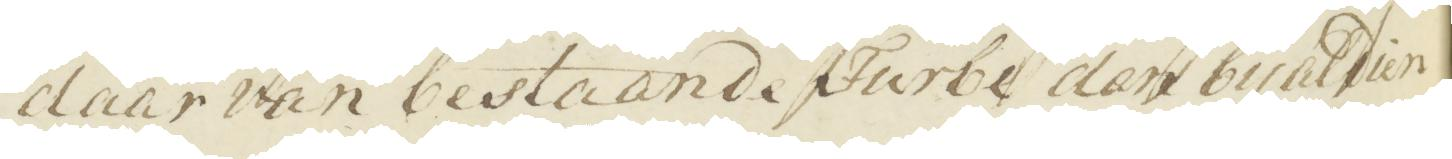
daar van bestaande Turbe, dan by aldien
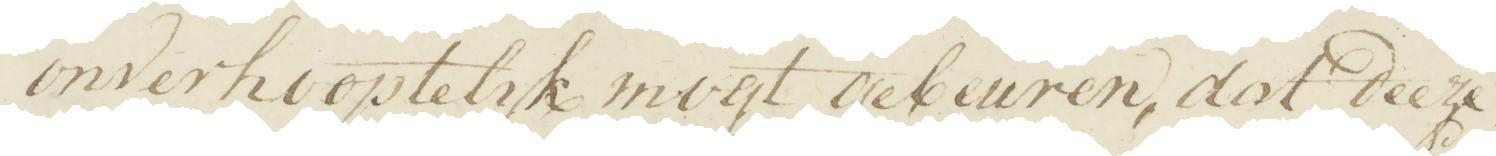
onverhooptelyk mogt gebeuren, dat deeze
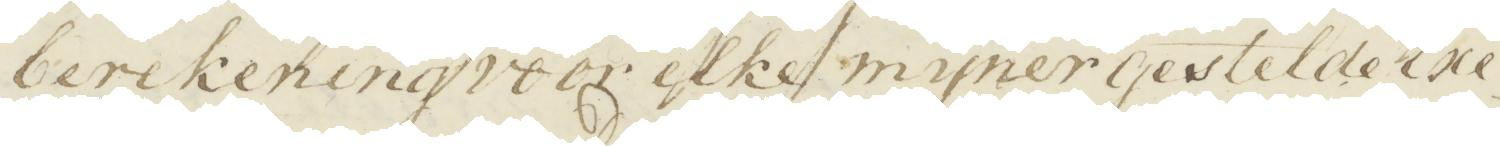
berekening voor elke myner gestelde Exe„
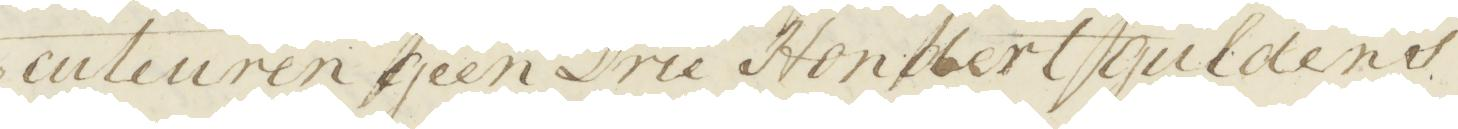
cuteuren geen Drie Hondert guldens.
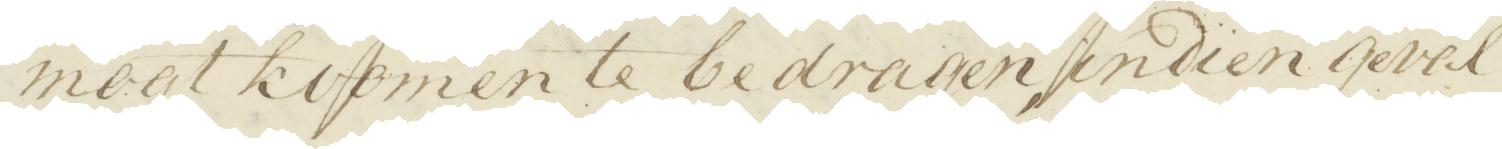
mogt koomen te bedragen, indien geval
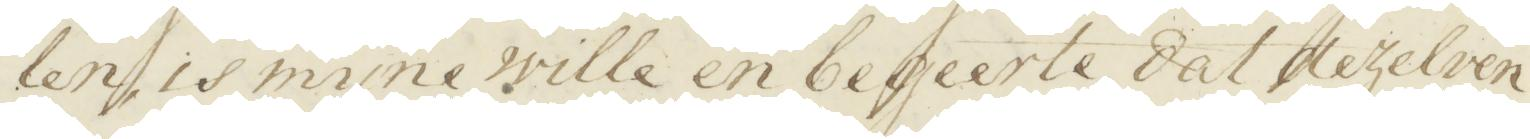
„len, is myne wille en begeerte, dat dezelven
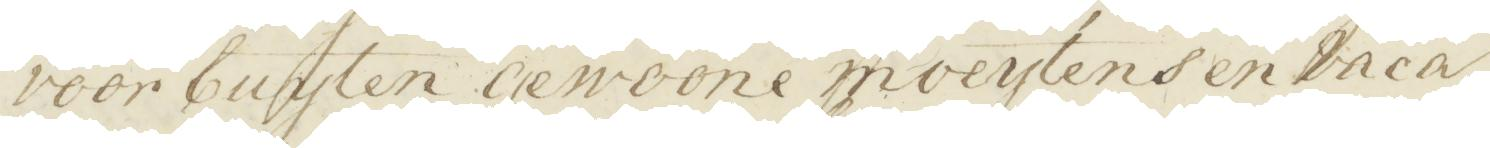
voor buyten gewoone moeytens en Vaca
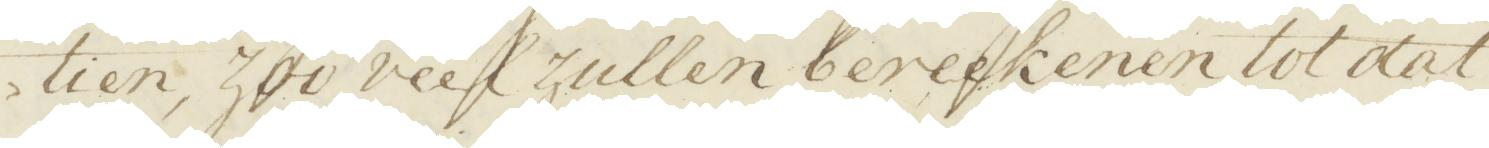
„tien, zoo veel zullen bereekenen, tot dat
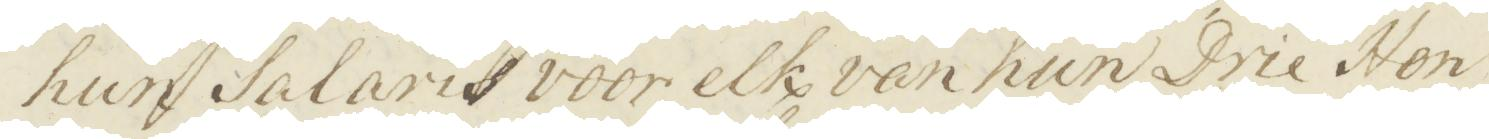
hun salaris voor elk van hun, Drie Hon„
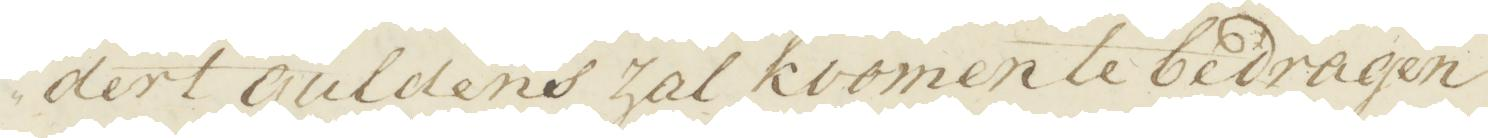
„dert guldens zal koomen te bedragen
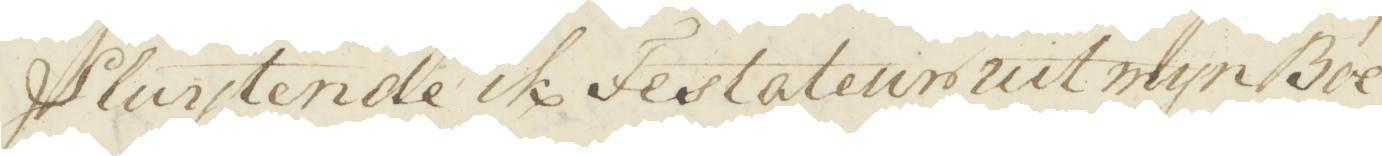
Sluytende ik Testateur uit myn Boe
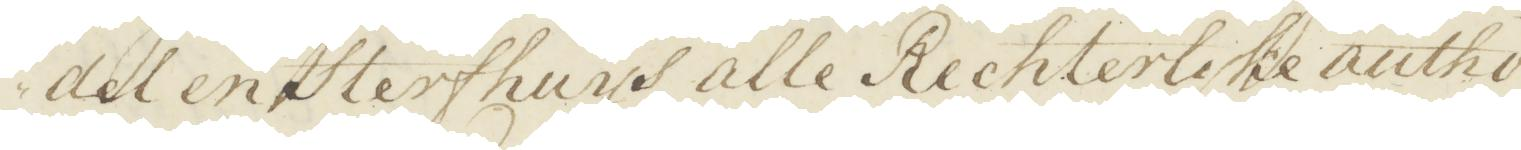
„del en Sterfhuys, alle Rechterlyke autho
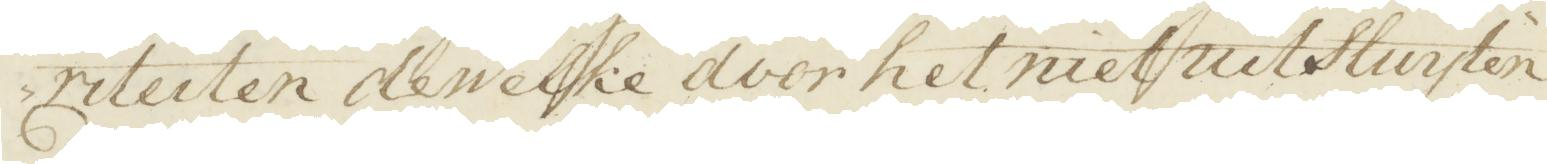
„riteiten dewelke door het niet uitsluyten
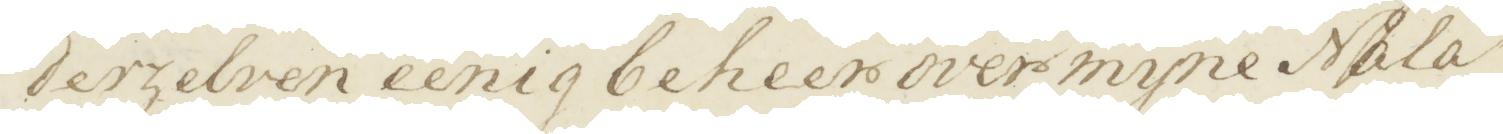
derzelven eenig beheer over myne Nala
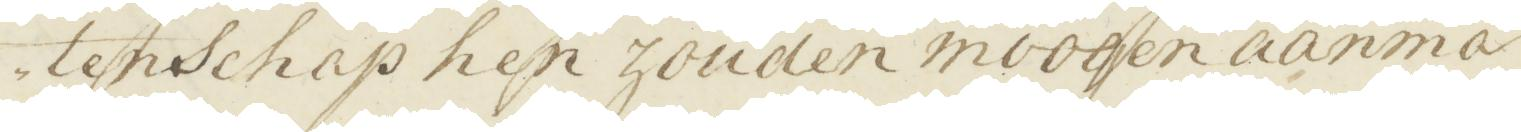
„tenschap hen zouden moogen aanma
